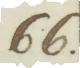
66.
